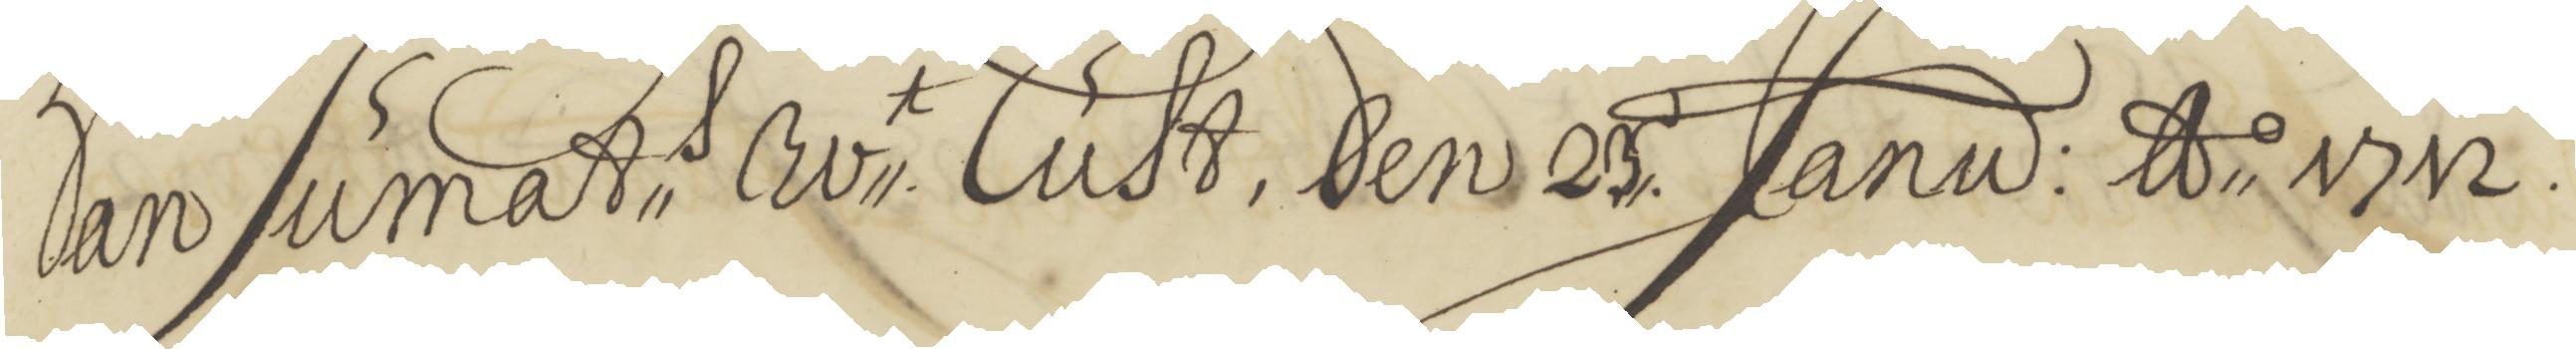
Van Sumat„s w„.t Cust, den 23„. Jann: A„o 1712.
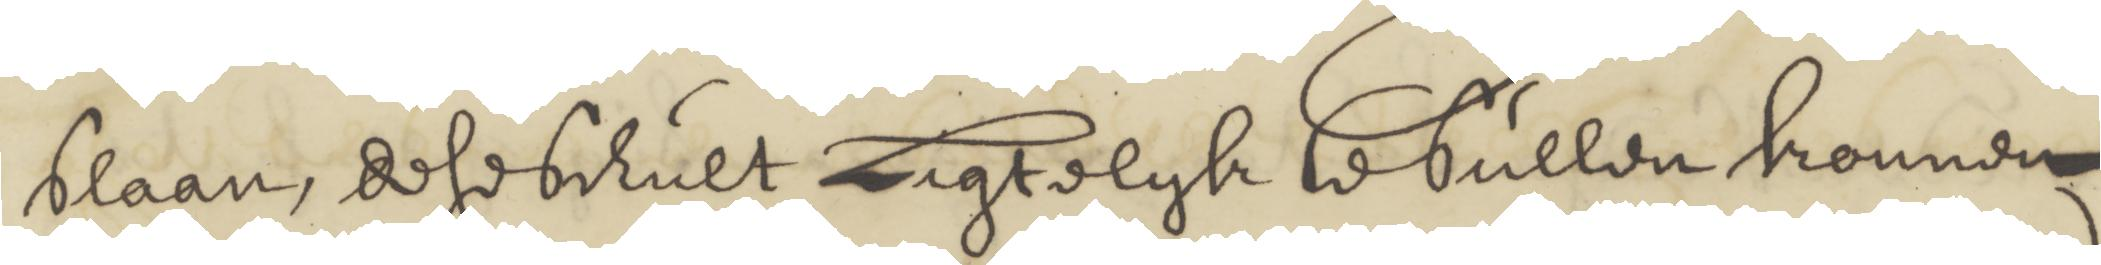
slaan, dese schult Ligtelijk te sullen konnen
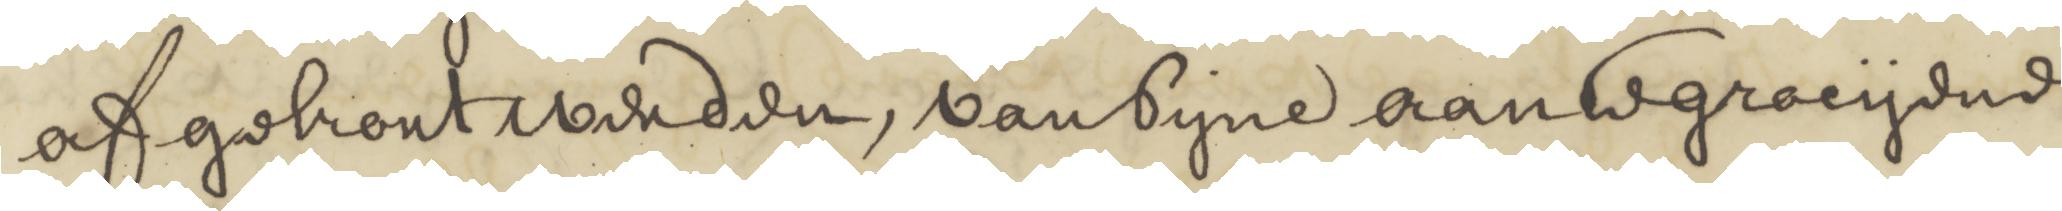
afgekort werden, van sijne aan te groeijene
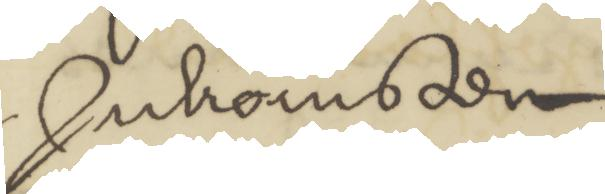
Jnkomsten.
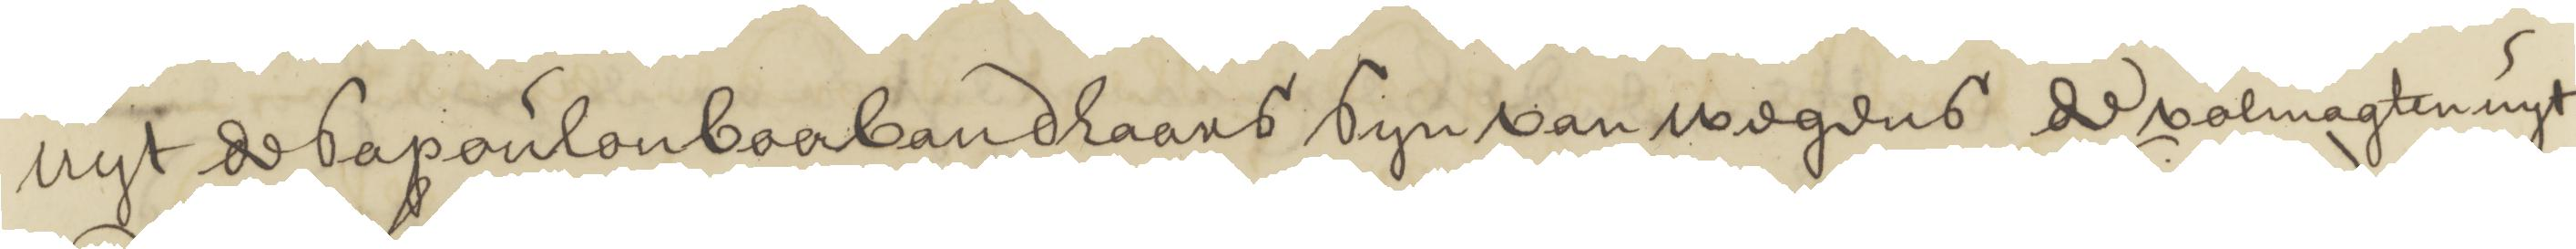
uyt de sapoulonboabandhaars sijn van wegens de volmagten uyt
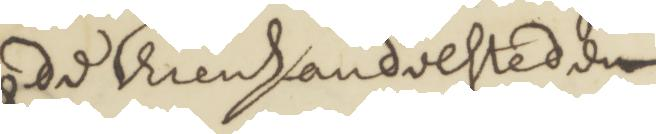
de thienhandelsteden
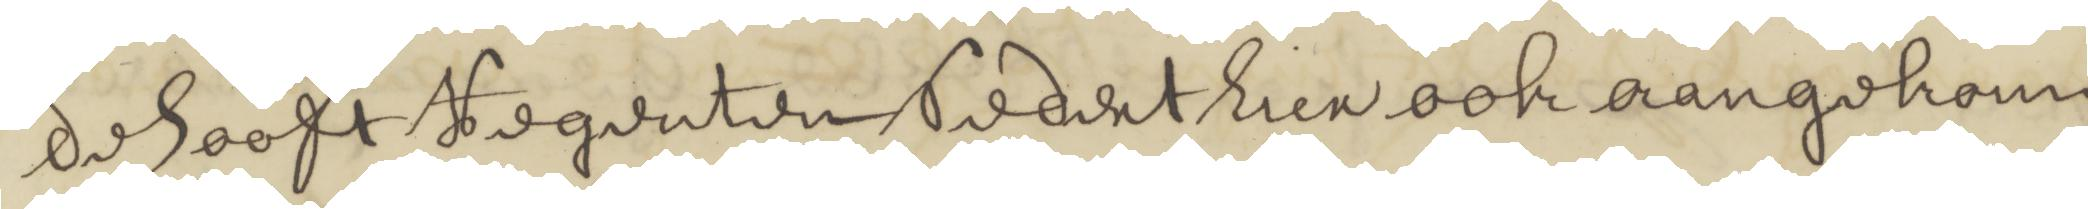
de hooft Regenten sedert hier ook aangekomen
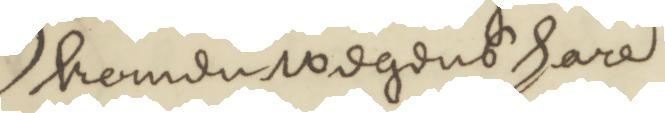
komen wegens hare
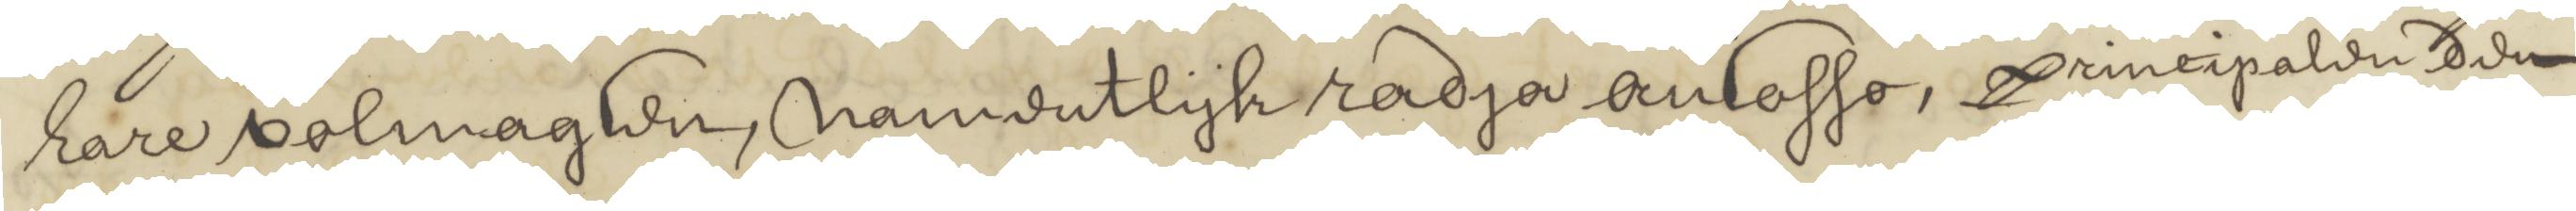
hare volmagten, namentlijk radja antosso, Principalen den
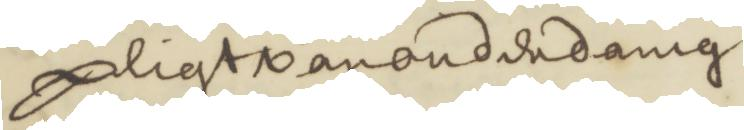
pligt van onderdanig
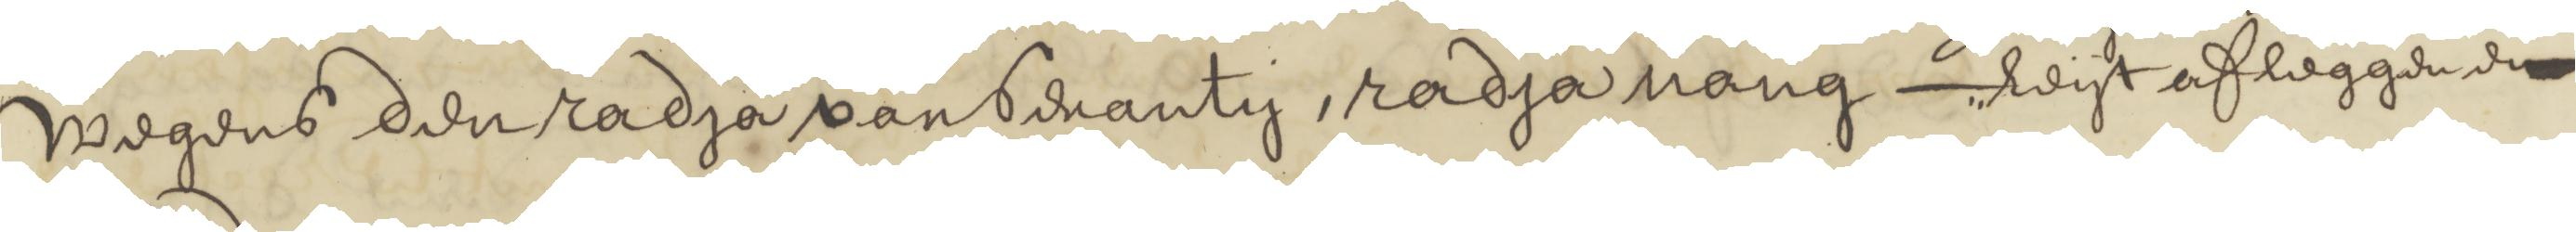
wegens den radja van serantij, radja nang „heijt afleggen en
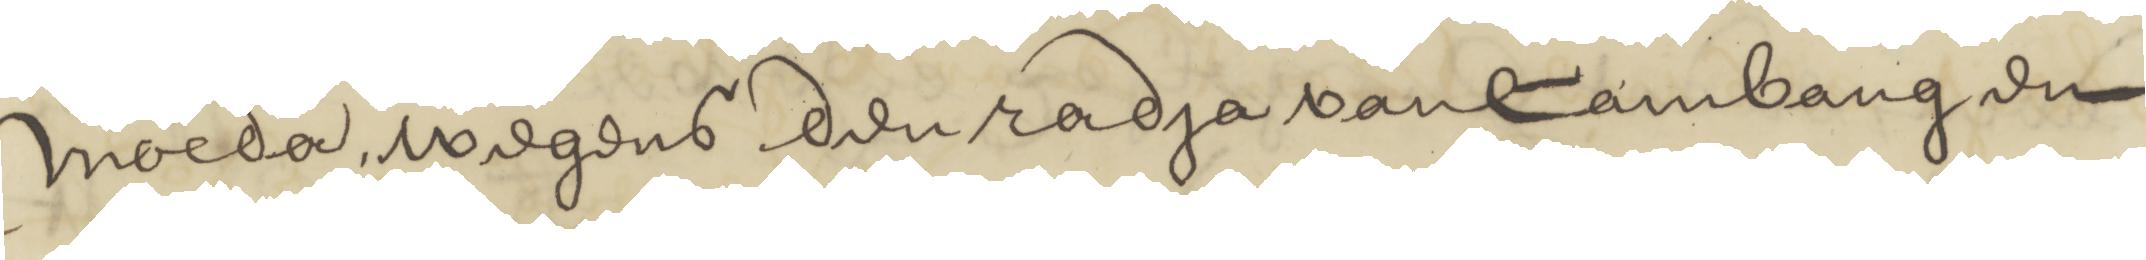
moeda, wegens den radja van Cambang en
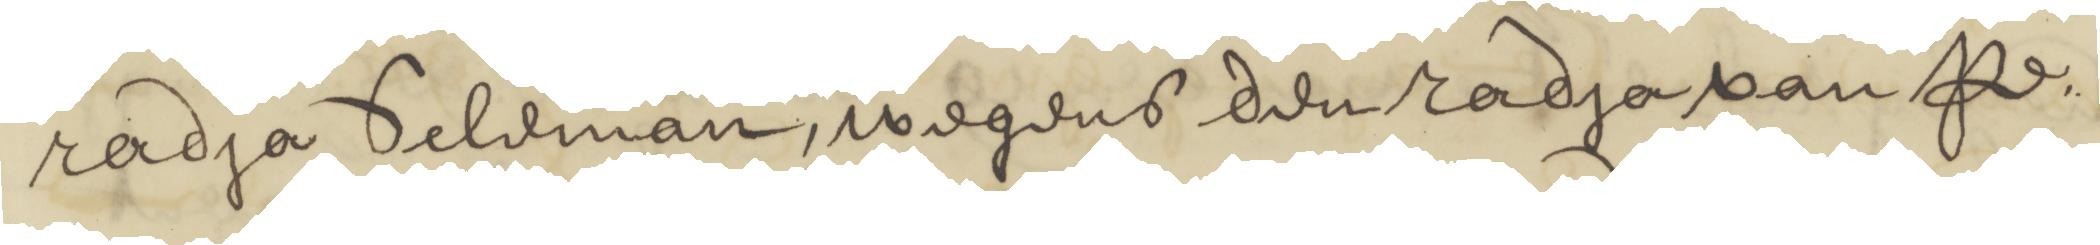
radja Seleman, wegens den radja van pe„
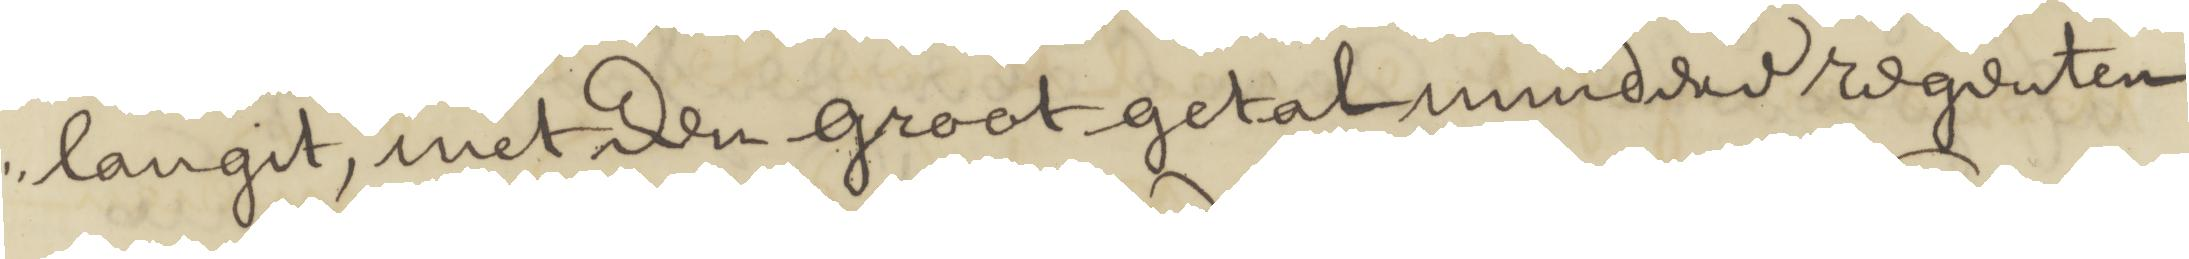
„langit, met Een groot getal mindere regenten
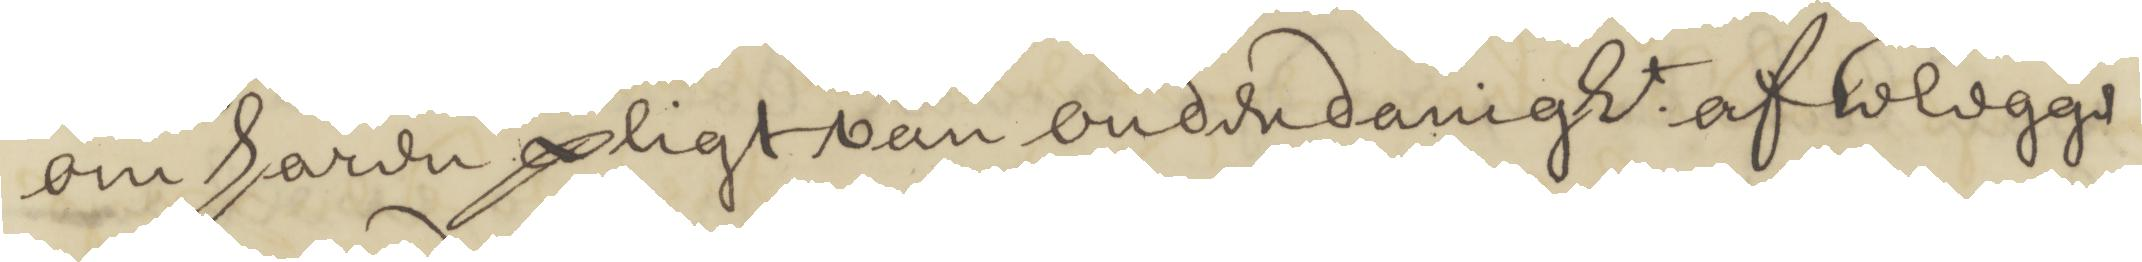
om haren pligt van onderdanigh.t af teleggen
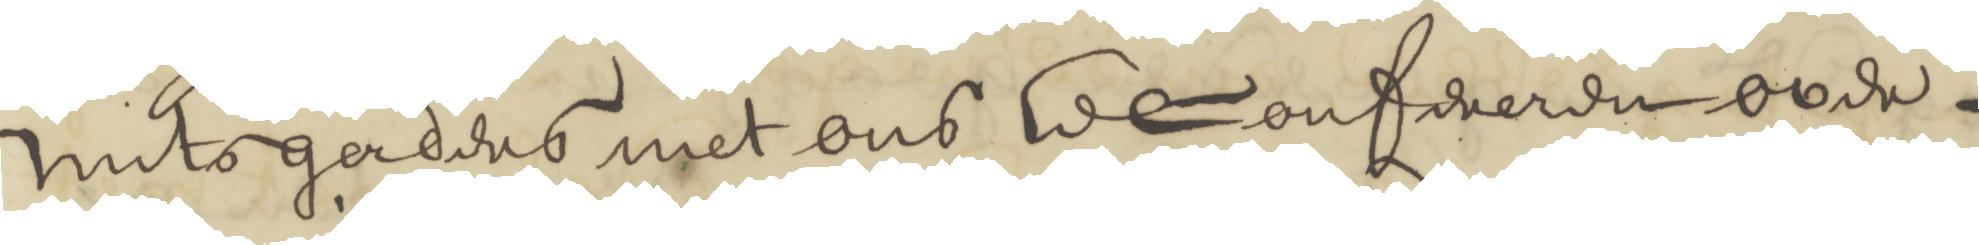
mitsgaders met ons te confereren over
